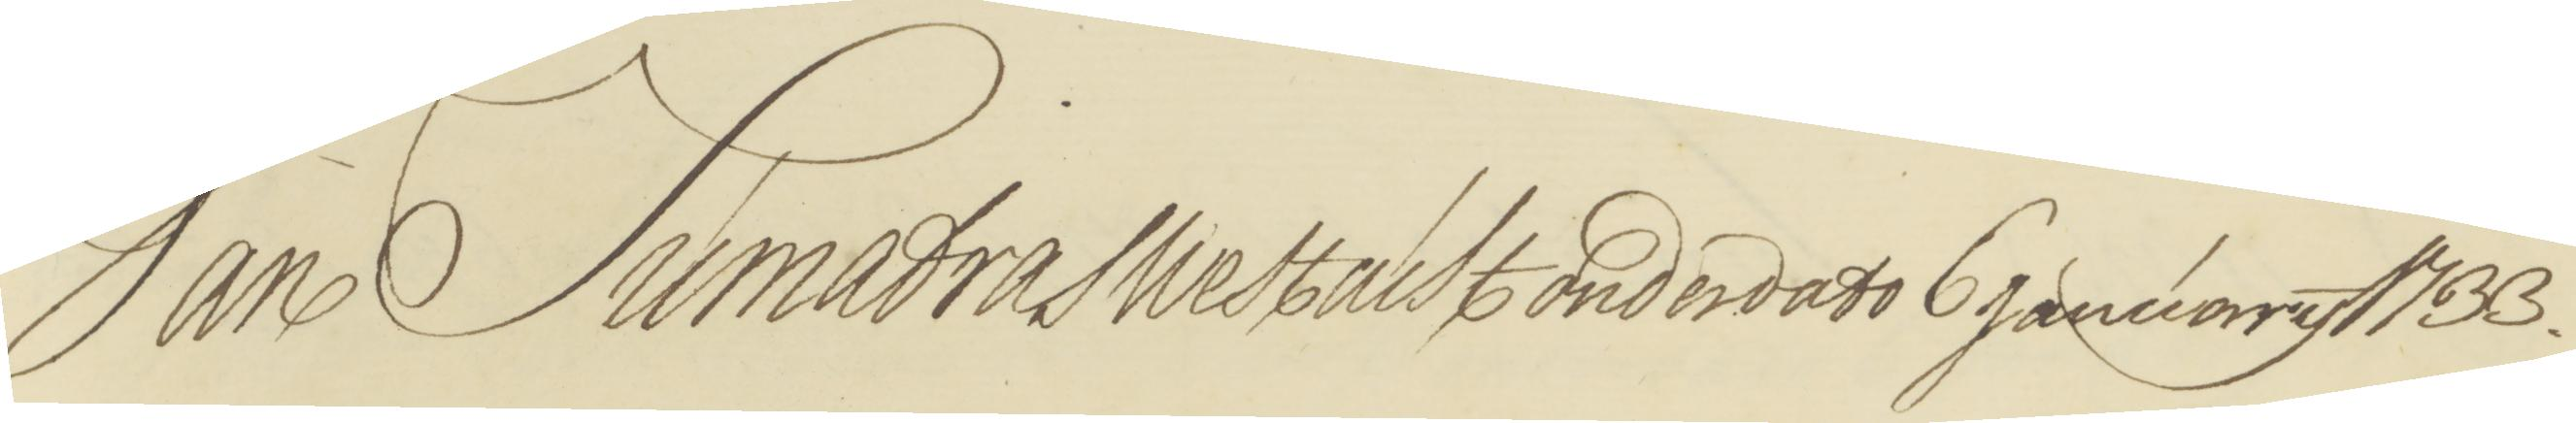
Van Sumatras westcust onder dato 6 januarij 1733._
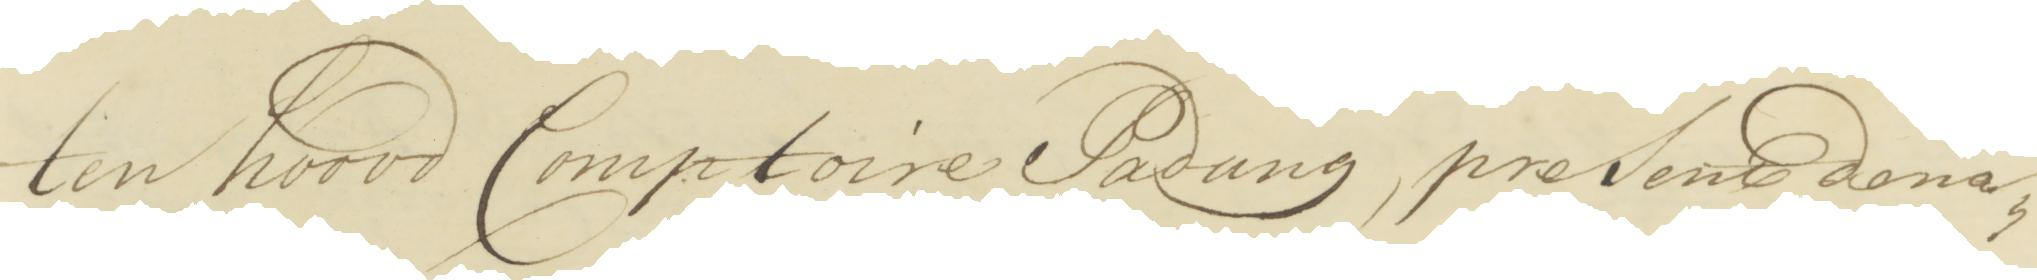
ten hoovd Comptoire Padang, present de na„
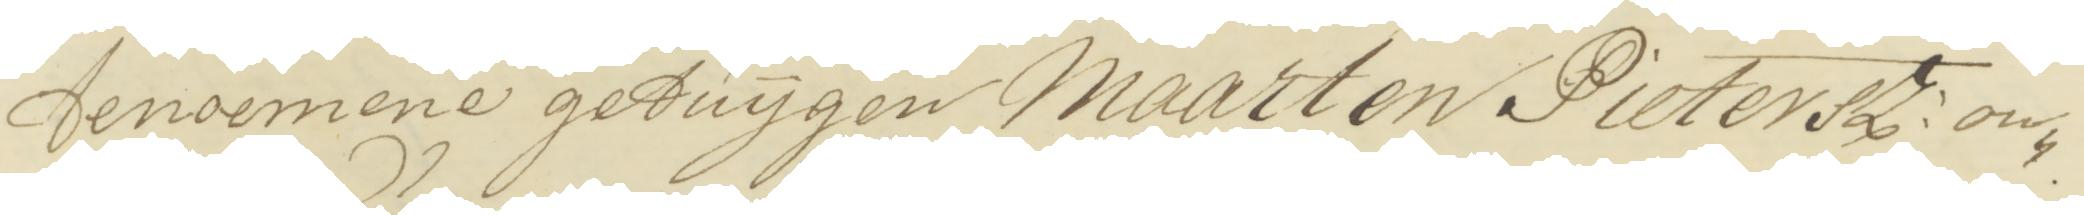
tenoemene getuijgen Maarten Pietersz: on„
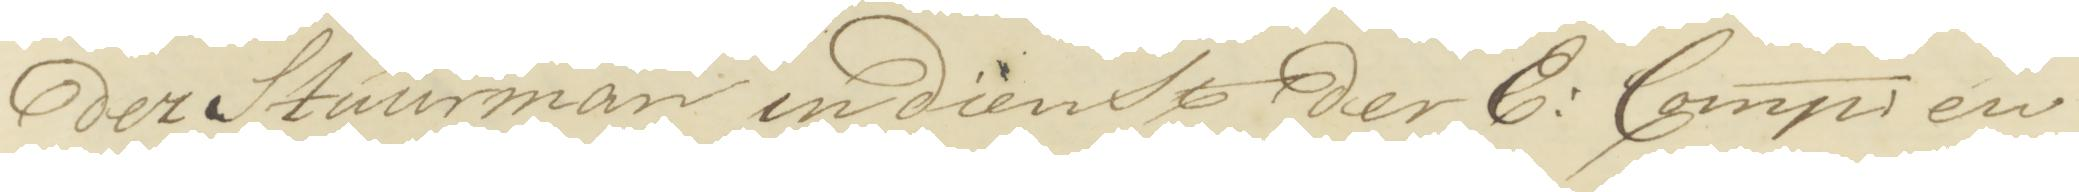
der stuurman in dienst der E: Comp: en
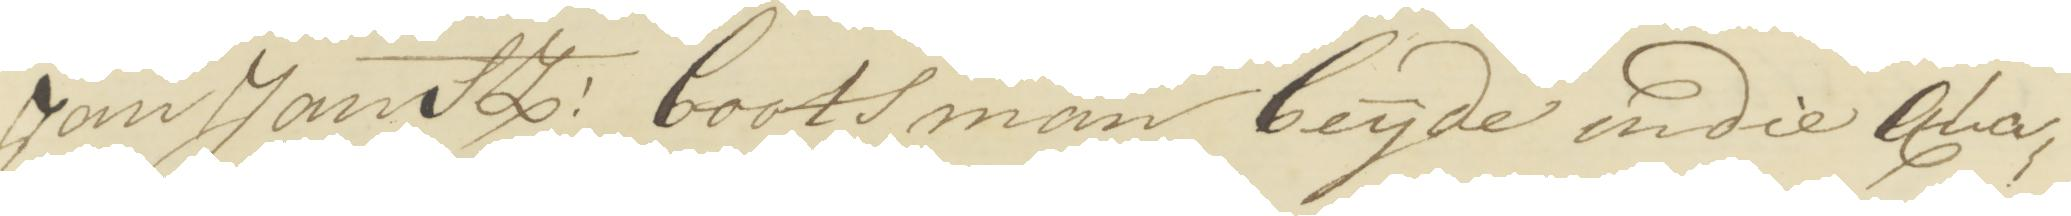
Jan Jansz: bootsman beijde in die Qua„
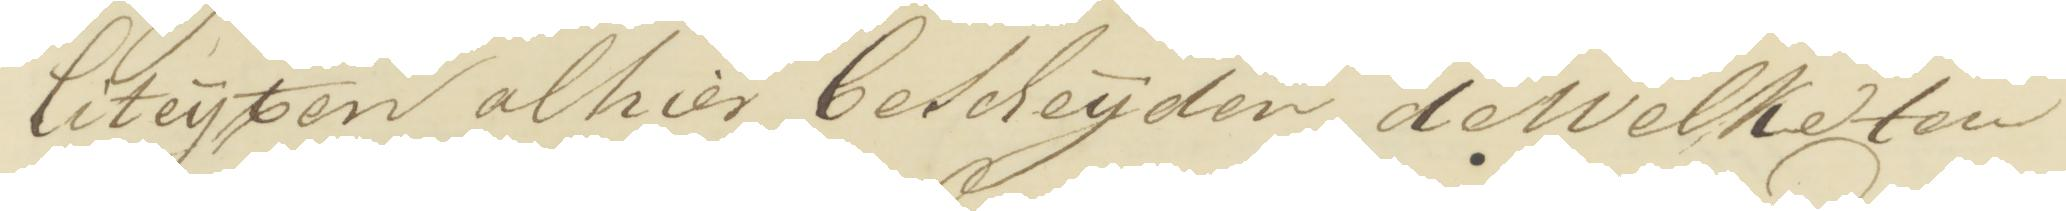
liteijten alhier bescheijden dewelke ten
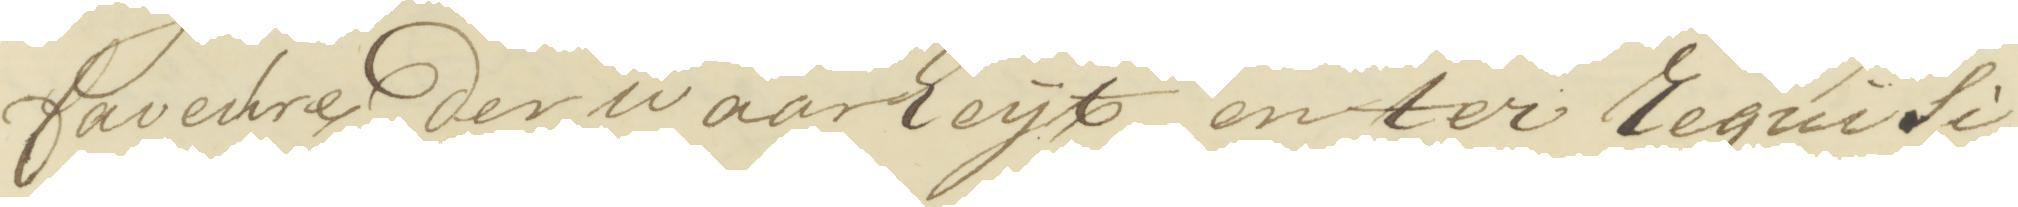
faveure, der waarheijt en ter requisi
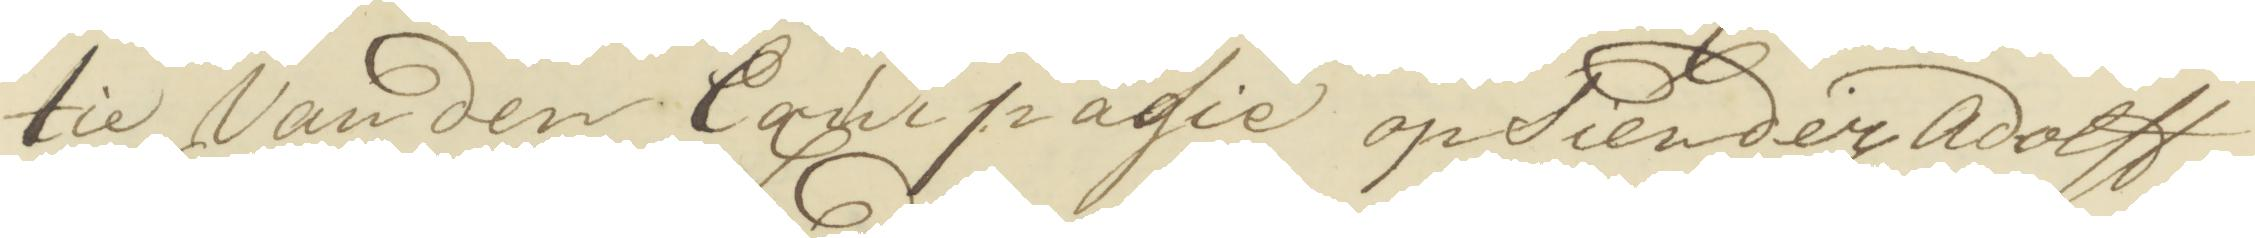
tie van den Equipagie opsiender Adolff
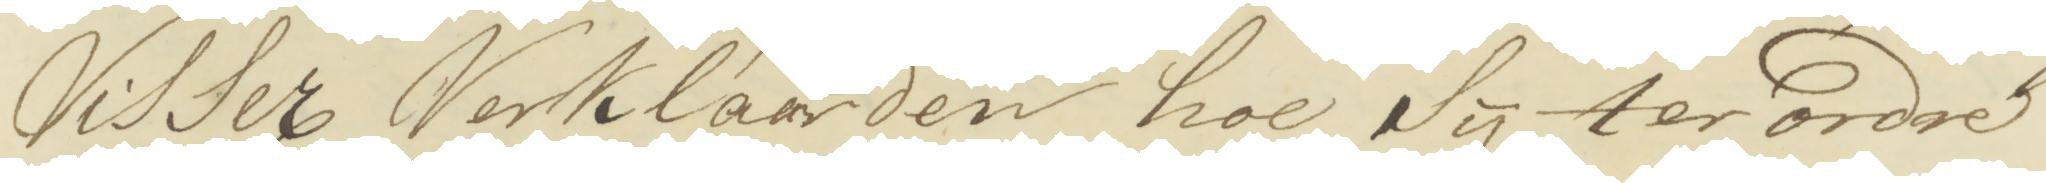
Visser Verklaarden hoe sij ter ordre
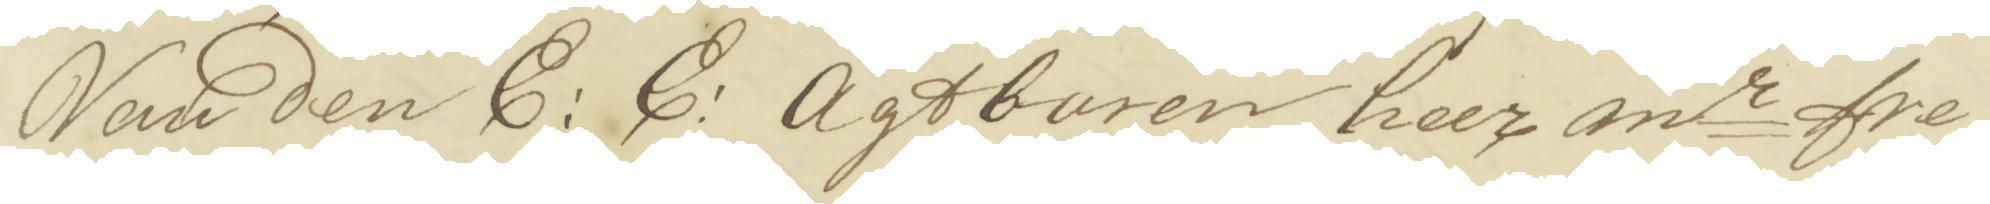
Van den E: E: Agtbaren heer m=r fre
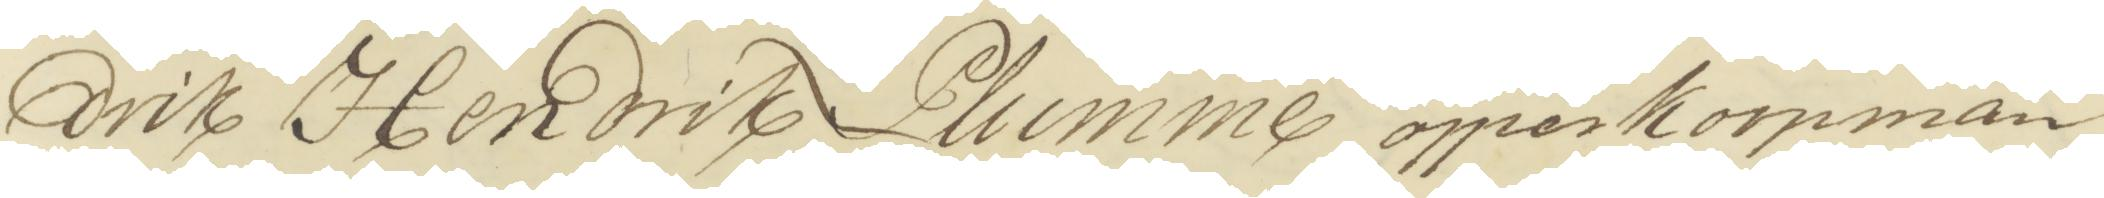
drik Hendrik Plumme opper koopman
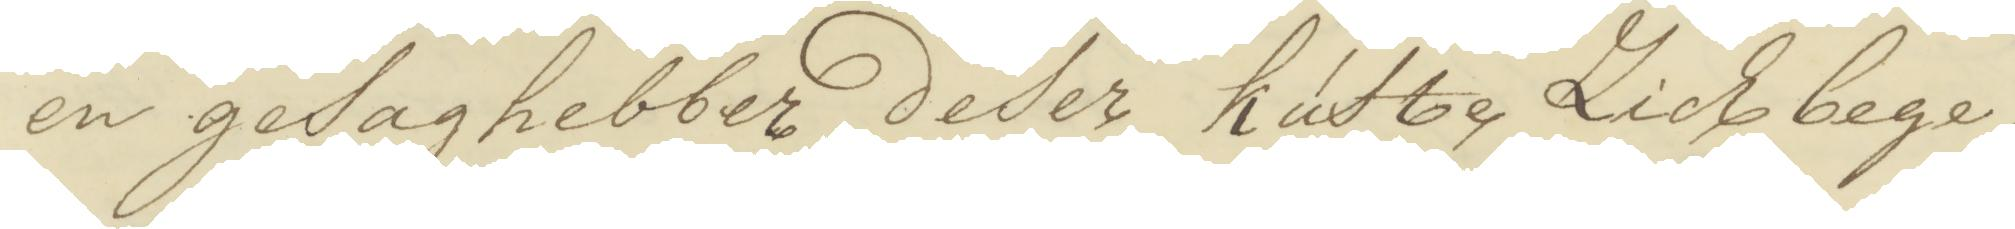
en gesaghebber deser kuste zich bege„
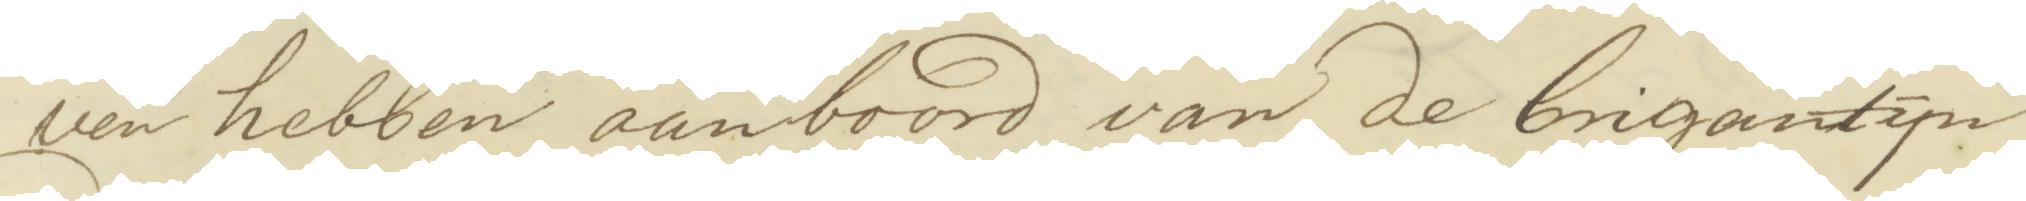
ven hebben aan boord van de brigantijn
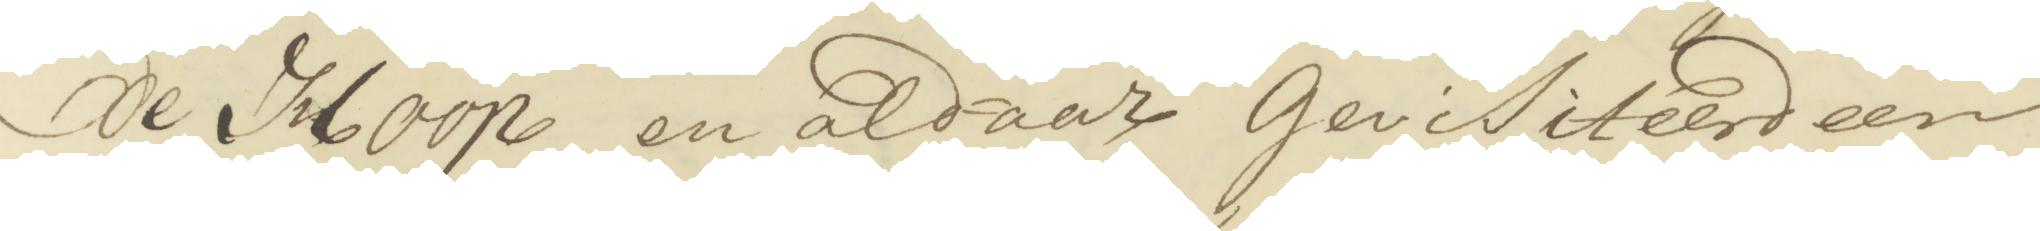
de Hoop en aldaar gevisiteerd een
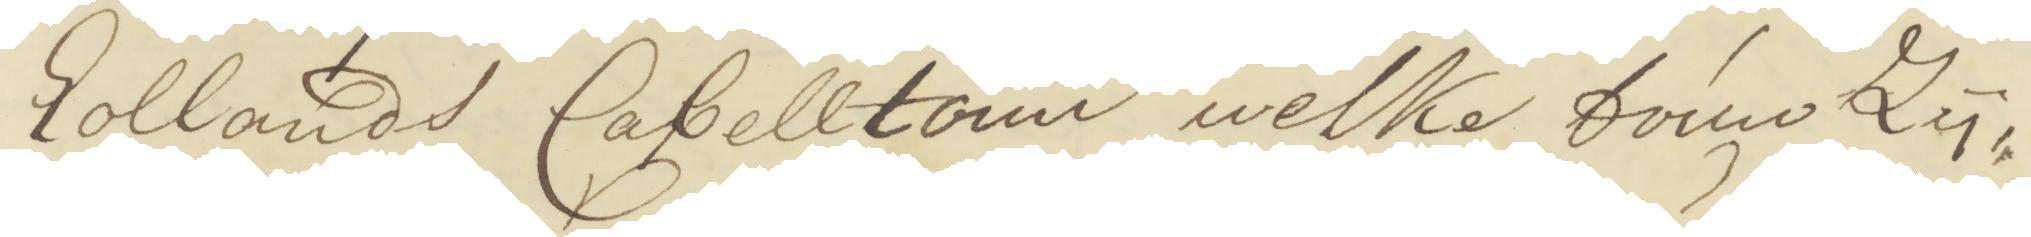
hollands Cabelltouw welke touw zij„
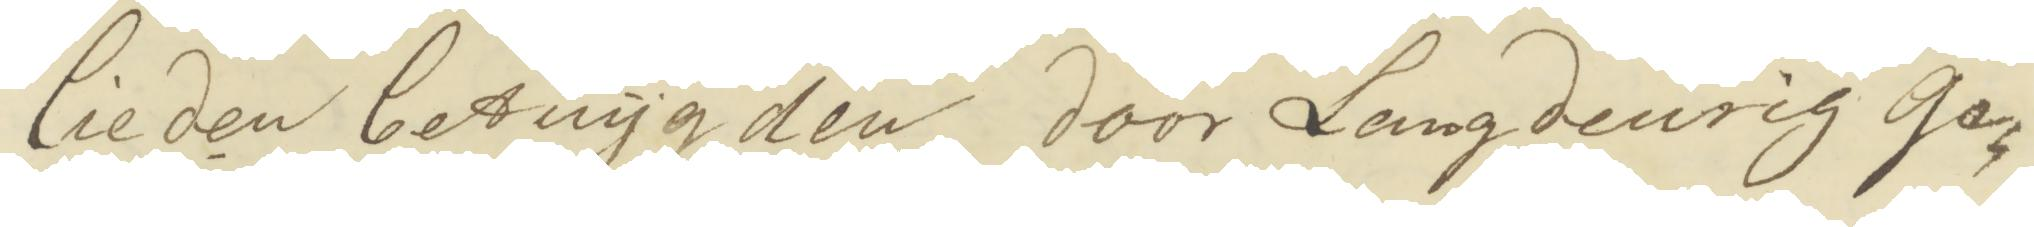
lieden betuijgden door Langdeurig ge„
